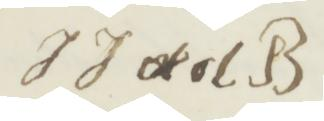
II vd B
